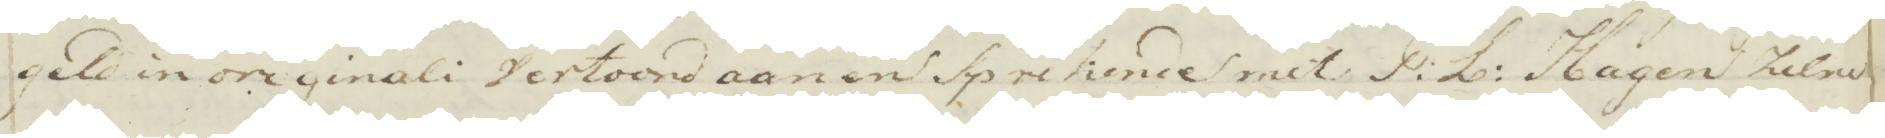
geld in originali vertoond aan en sprekende met P: L: Hagen zelve
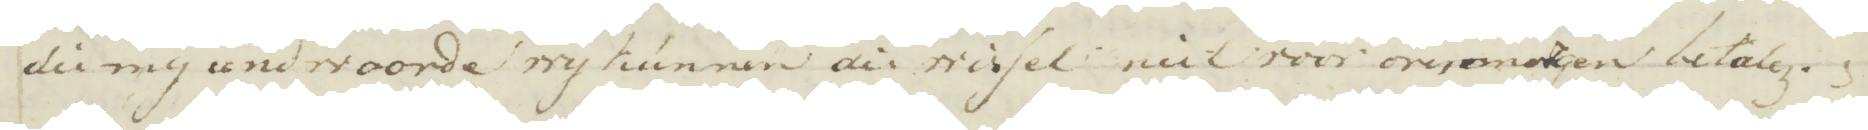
die my andwoorde wy kunnen die wissel niet voor overmorgen betalen.
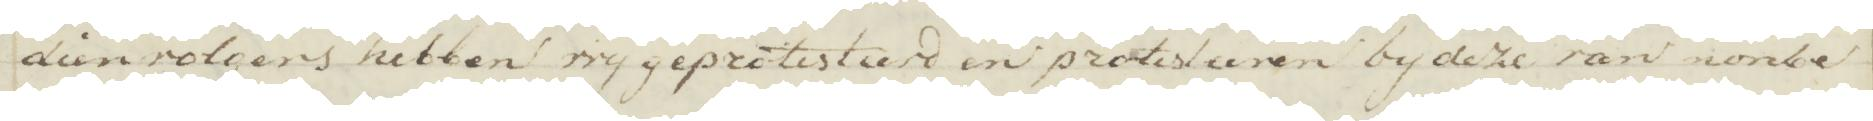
dienvolgers hebben wy geprotesteerd en protesteeren by deze van nonbe
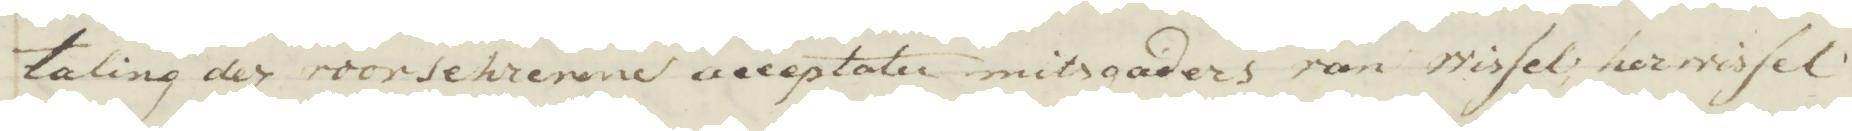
taling der voorschrevene acceptatie mitsgaders van wissel, herwissel
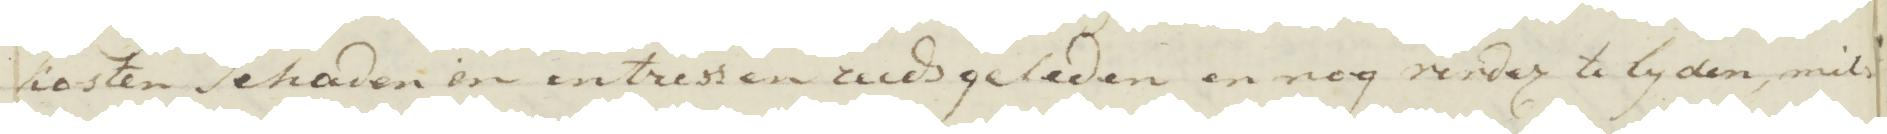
kosten schaden en intressen reeds geleden en nog verder te lyden, mits
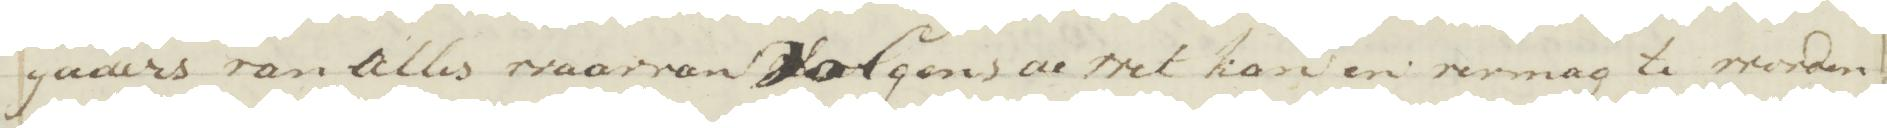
gaders van alles waarvan Volgens de wet kan en vermag te worden
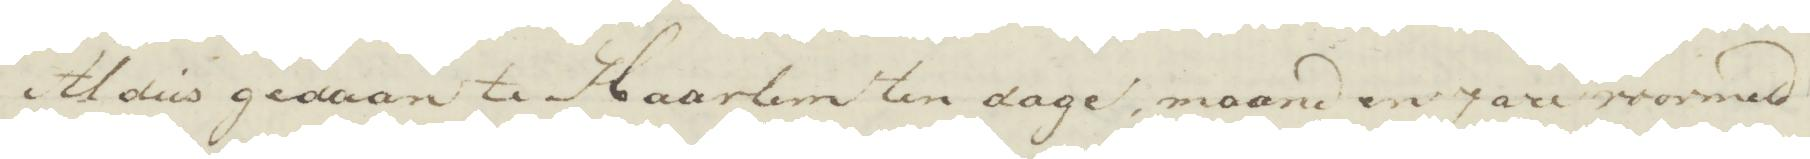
Aldus gedaan te Haarlem ten dage, maand en Jare voormeld
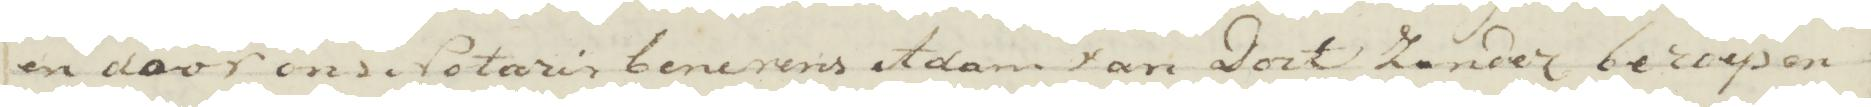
en door ons Notaris benevens Adam van Dort zonder beroep en
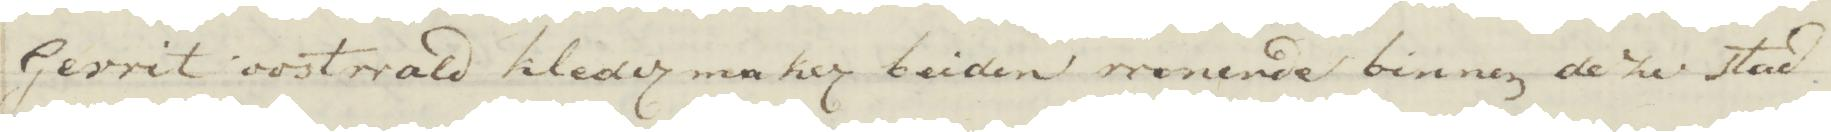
Gerrit oostwald kleder maker beiden wonende binnen deze stad
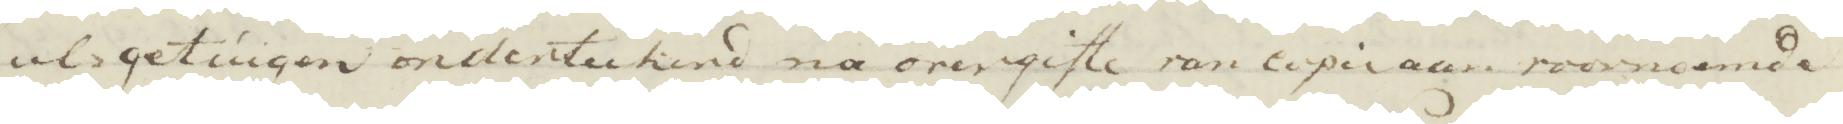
als getuigen onderteekend na overgifte van copia aan voornoemde
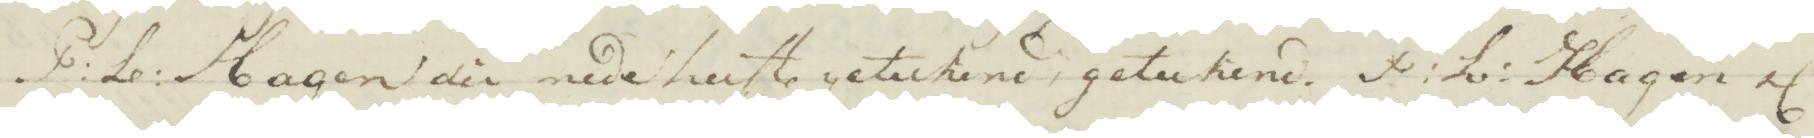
P: Le: Hagen die mede heeft geteekend, geteekend. P: Le: Hagen & C
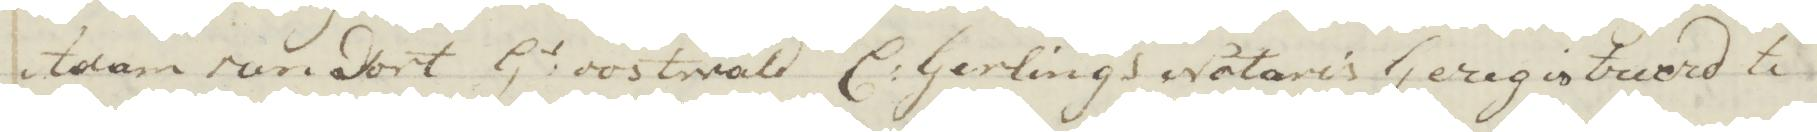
Adam van Dort G:t oostwald C: Gerlings Notaris Geregistreerd te
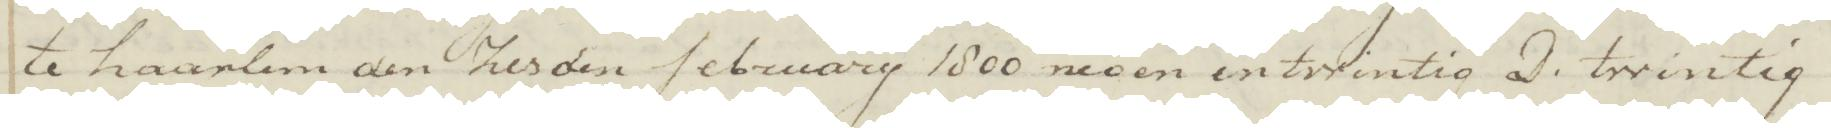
te haarlem den Zesden february 1800 negen en twintig D. twintig
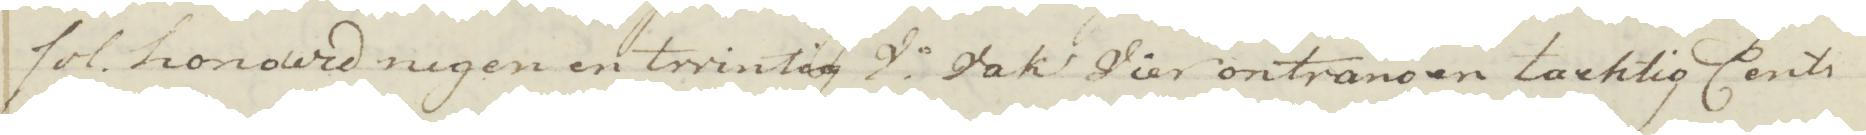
fol. honderd negen en twintig V.o Vak Vier ontvangen tachtig Cents
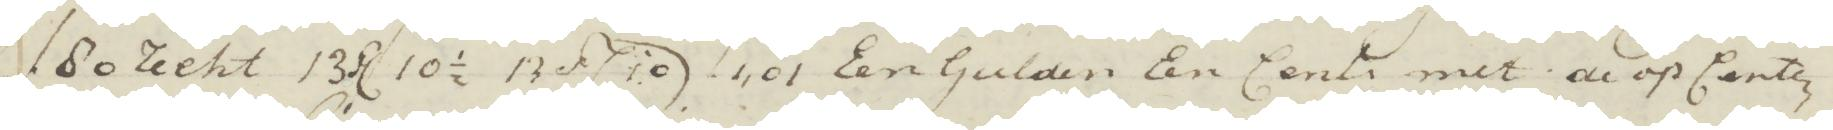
ƒ 80 recht 13 pC 10½ 13pC 10) . 401 Een Gulden Een Cents met de op Centen
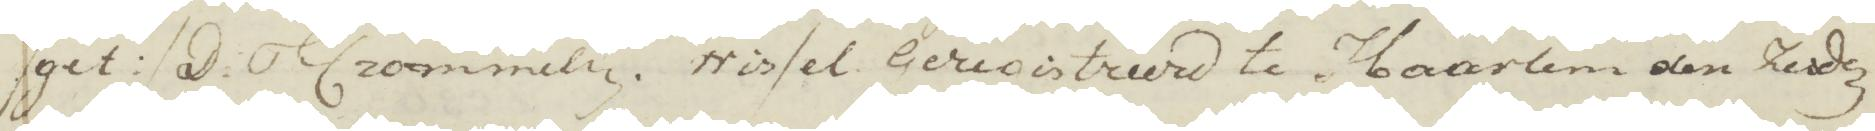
/get:/ D: Crommelin, Wissel Geregistreerd te Haarlem den zesden
